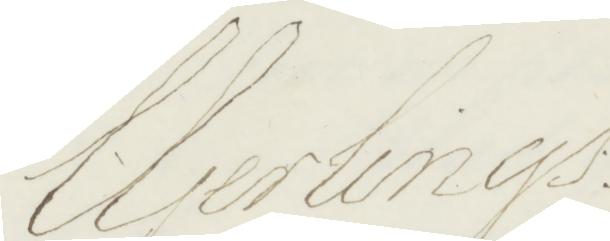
C Gerlings.
